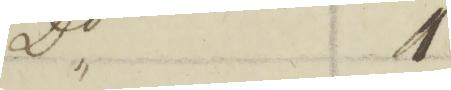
D„o 4
